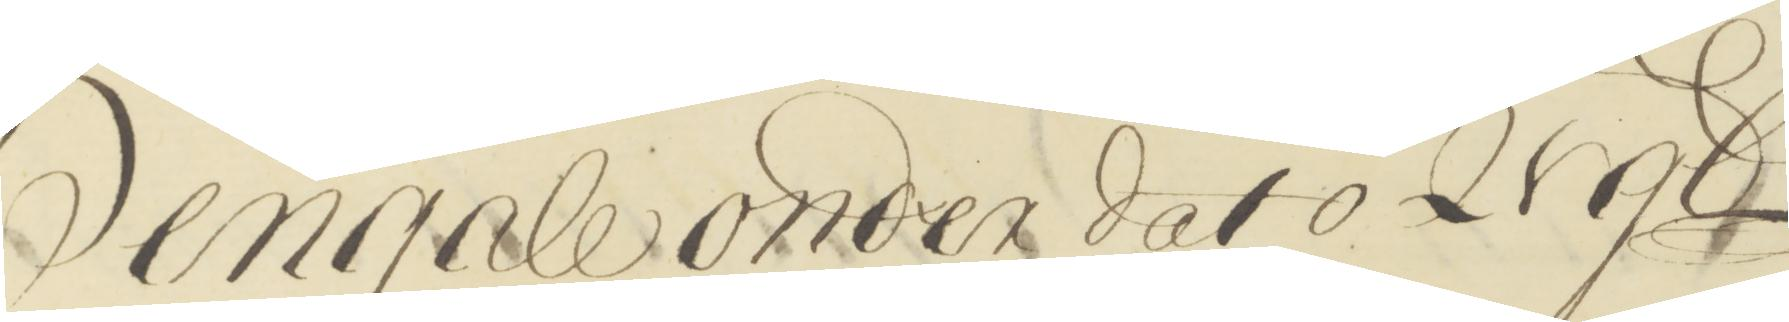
Van Bengale onder dato 25 gb 1732
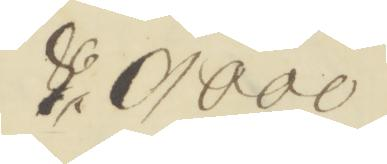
R:o/a 9000
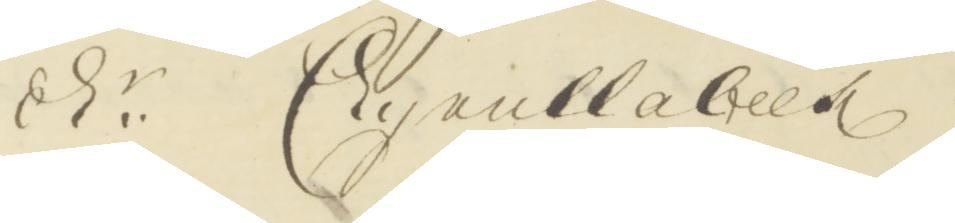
dh:r Chyrullabeek
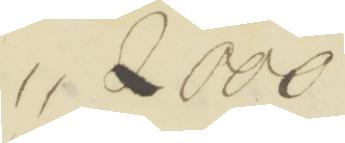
„ 2000
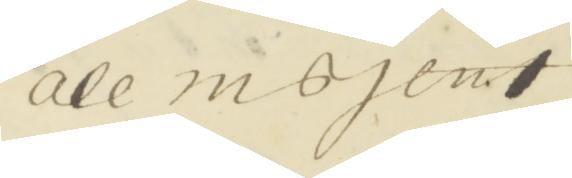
„ alemsjent
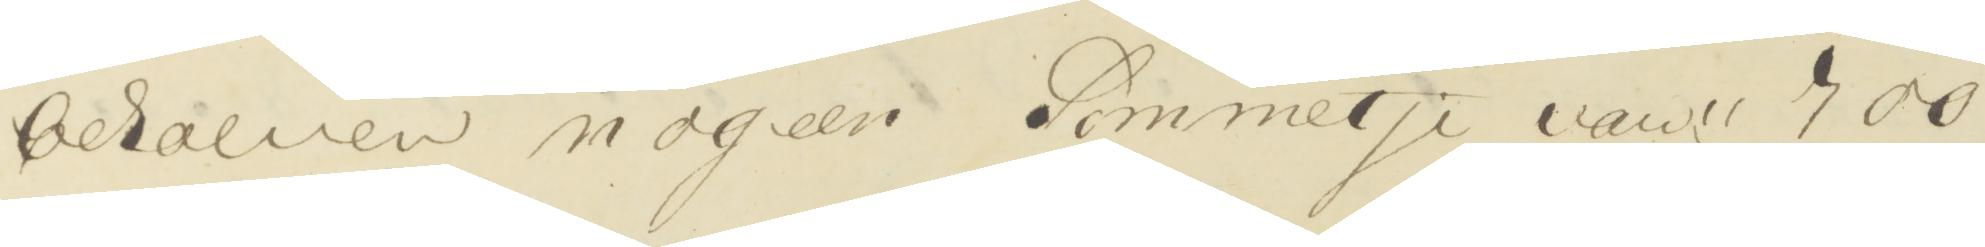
behalven nog een Sommetje van „ 700
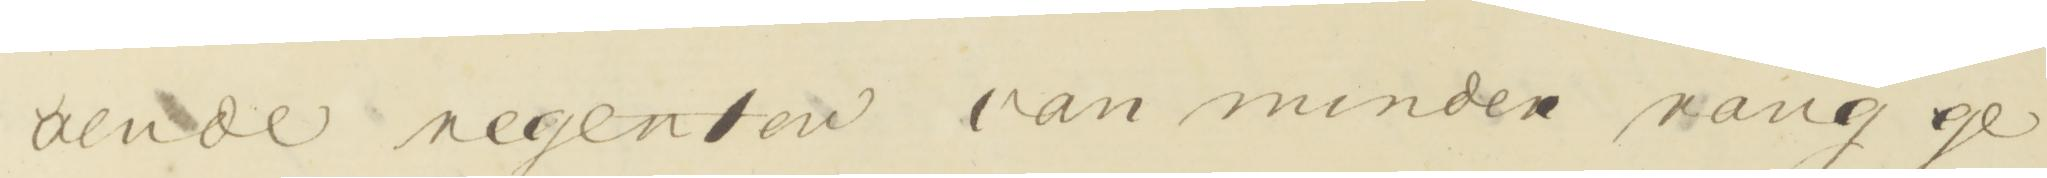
den de regenten van minder rang ge
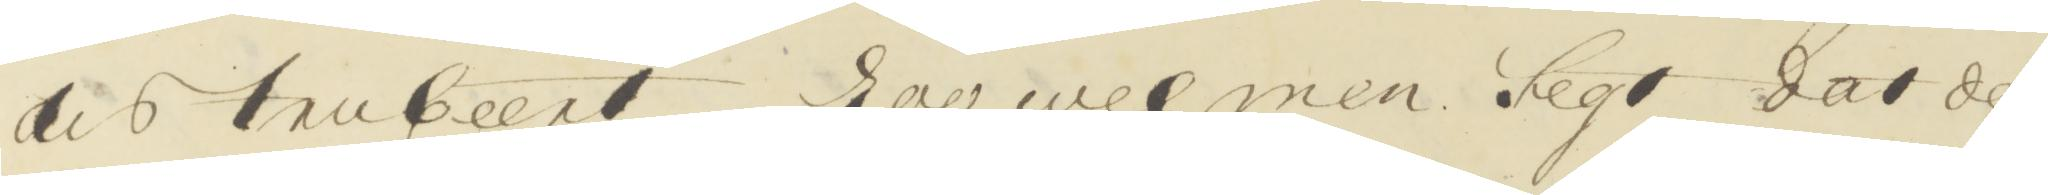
distrubeert hoewel men Segt dat de
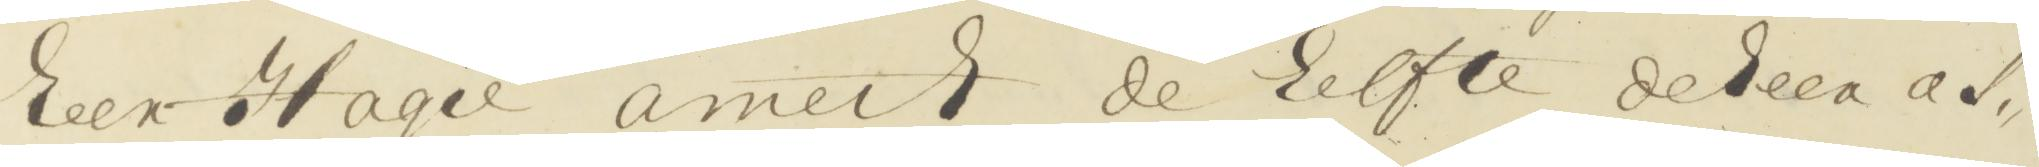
heer Hagie amech de helfte de heer as„
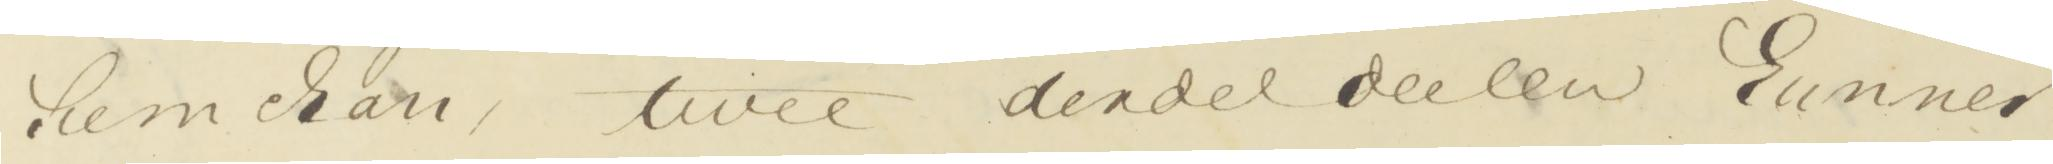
hemchan, twee derde deelen hunner
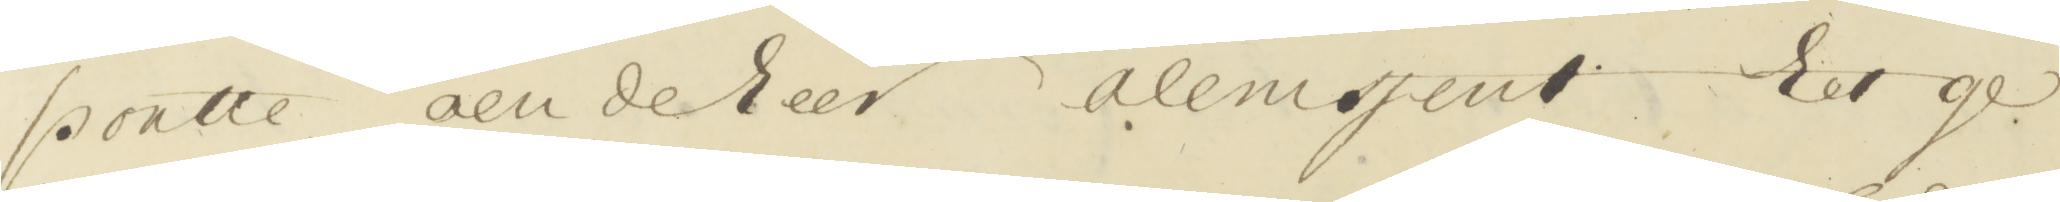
portie aen de heer alemsjsent het ge
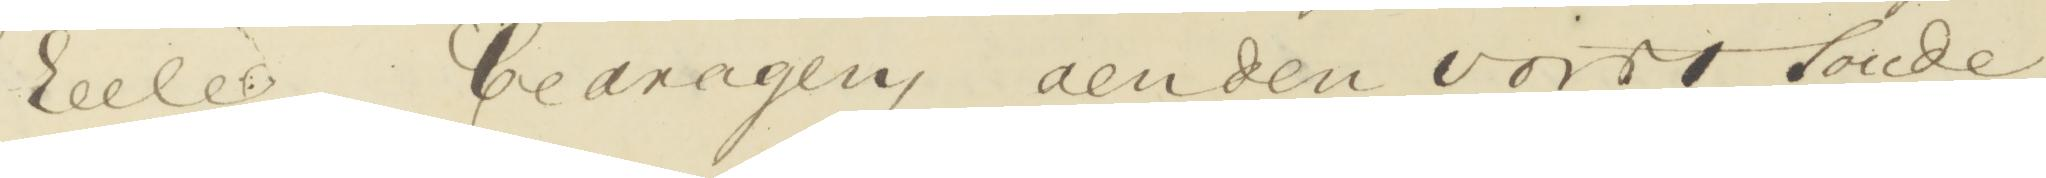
heele bedragen, aen den vorst Soude
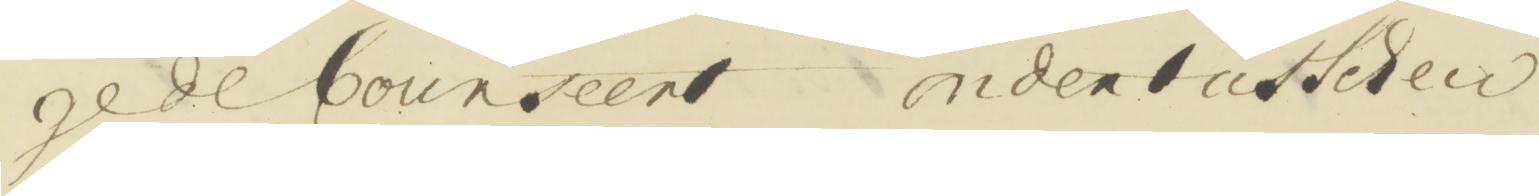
hebben gedebourseert ondertusschen
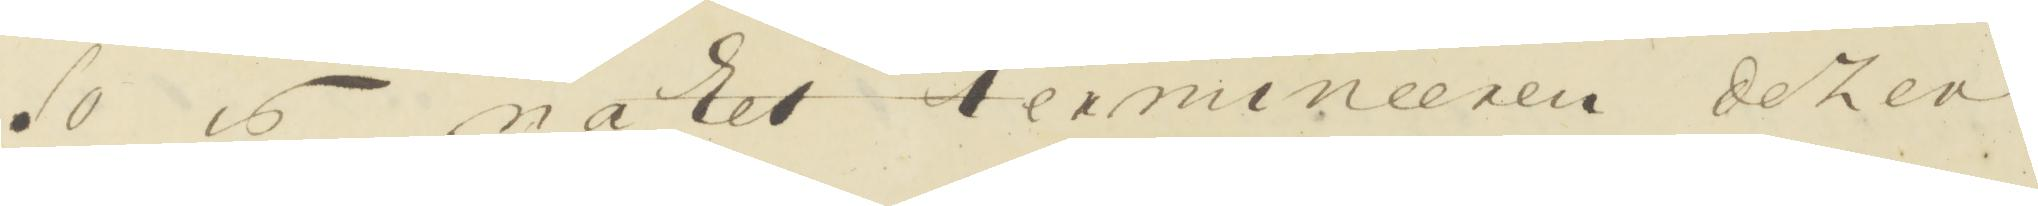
So is na het termineeren dezer
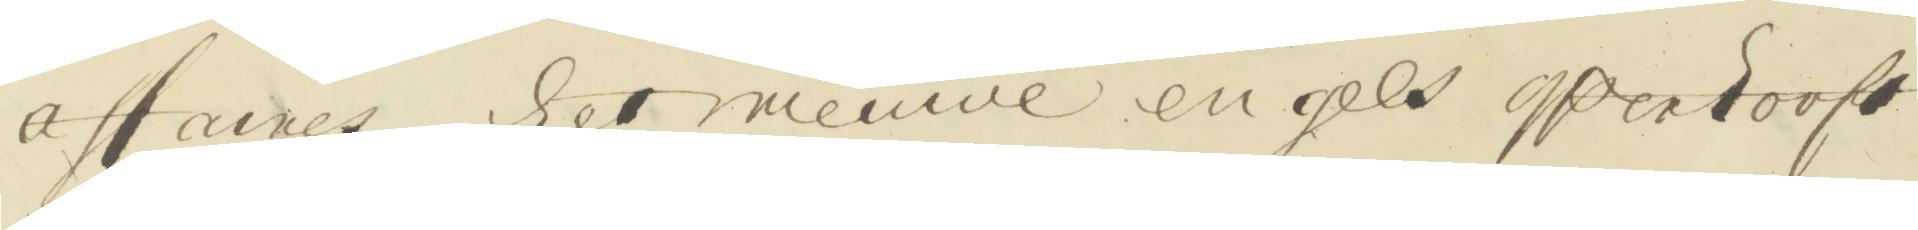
affaires het nieuwe engels operhooft
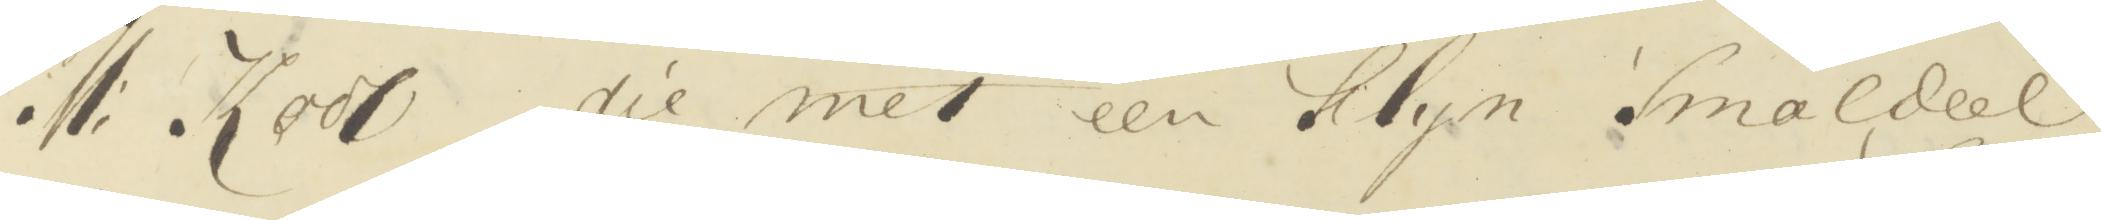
M: Kooc die met een klyn smaldeel
